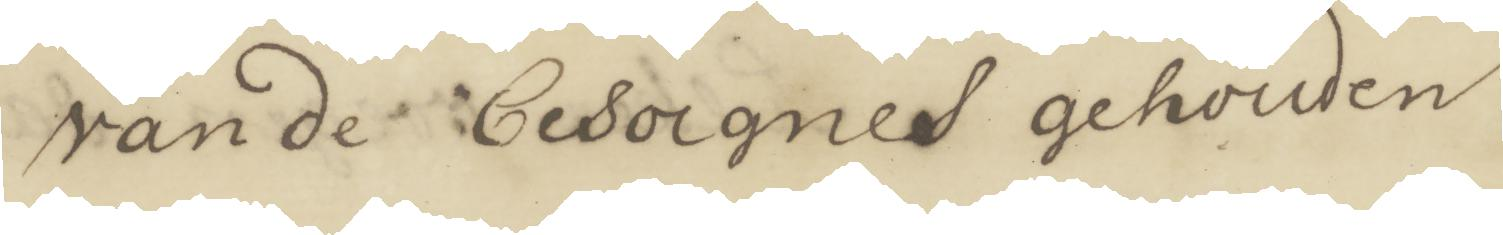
van de besoignes gehouden
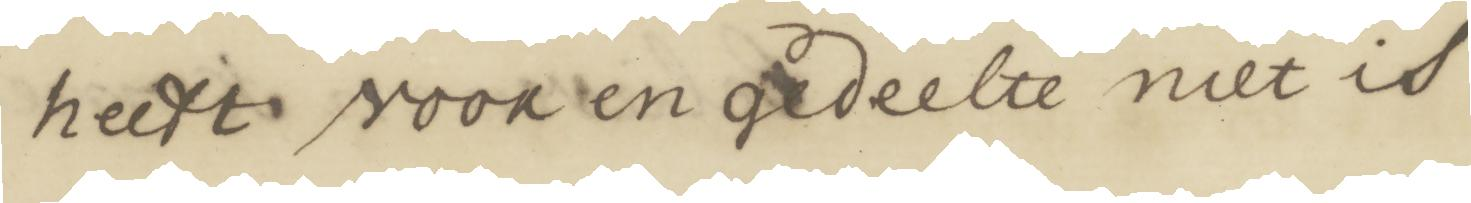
heeft voor en gedeelte niet is
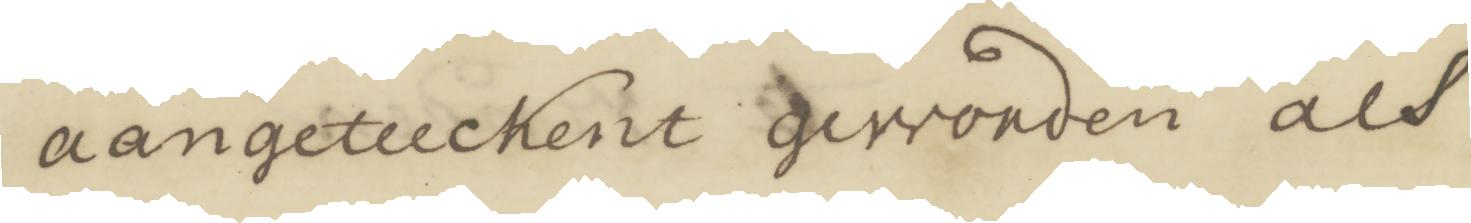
aangeteeckent geworden als
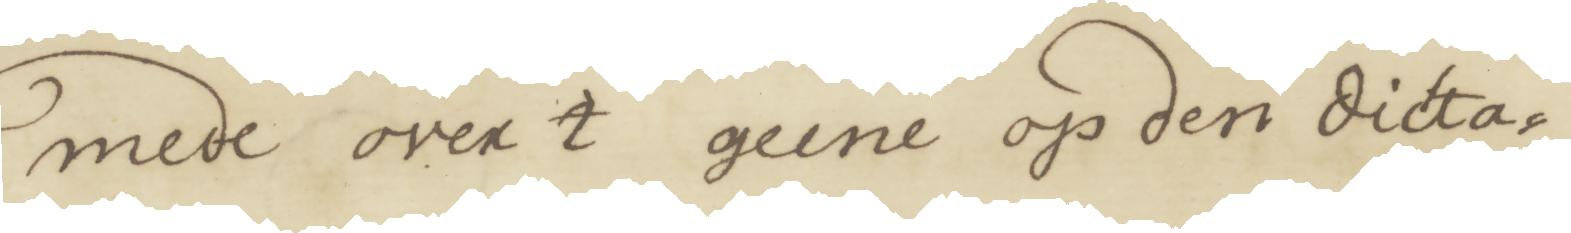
mede over t geene op den dicta„
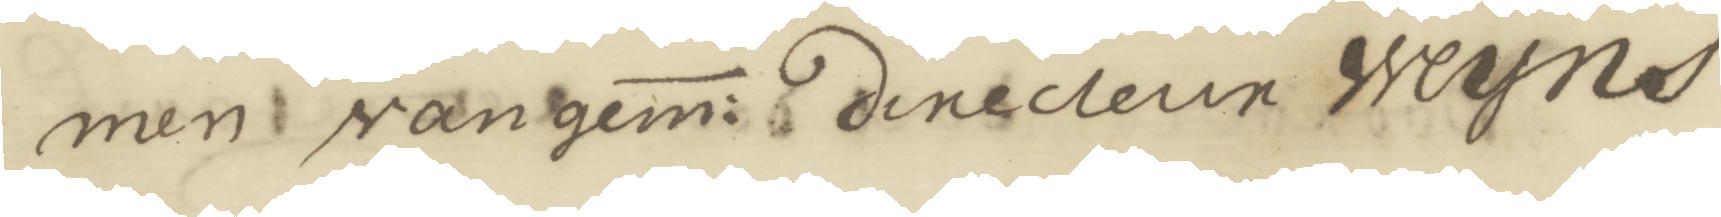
men van gem: directeur weyns
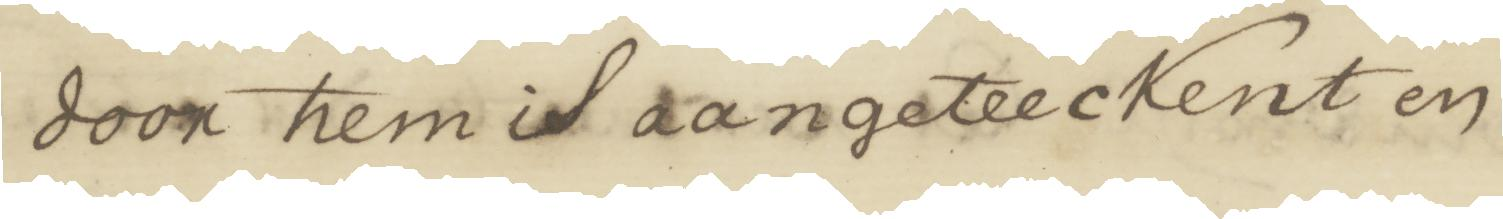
door hem is aangeteeckent en
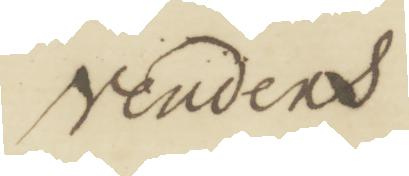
verders
